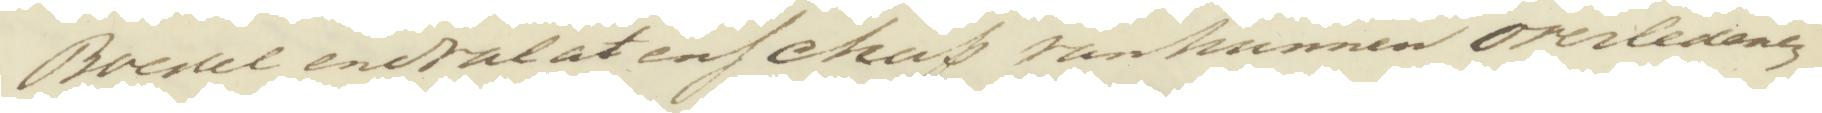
Boedel en Nalatenschap van hunnen overledenen
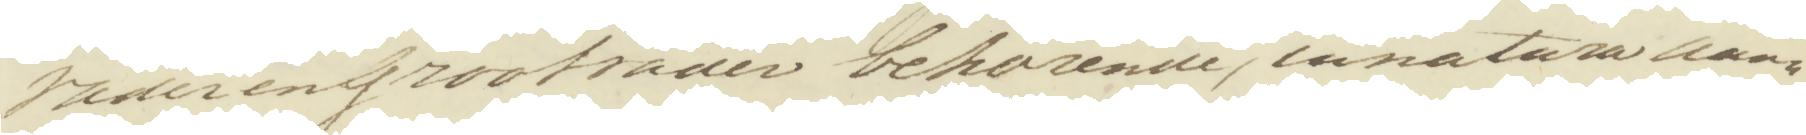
Vader en Grootvader behorende, in natura aan
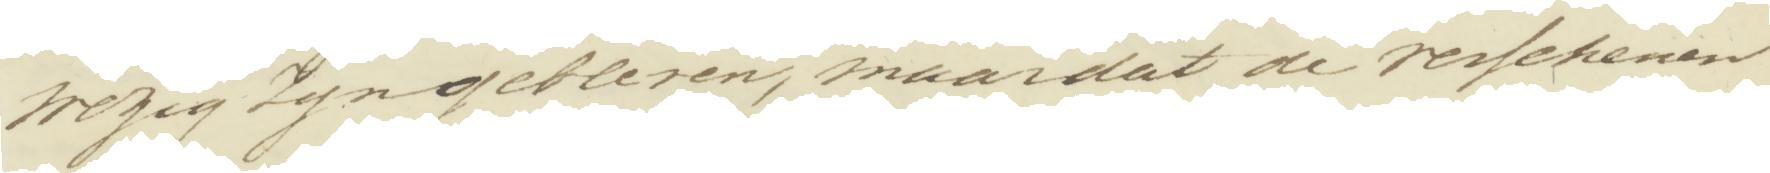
wezig zyn gebleven, maar dat de verschenen
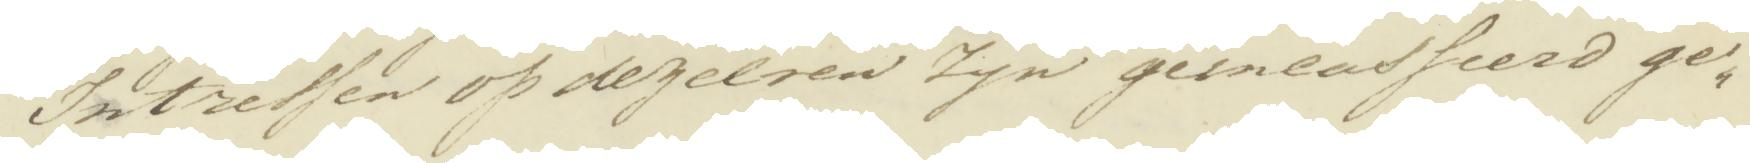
Intressen op dezelven zyn geincasseerd ge„
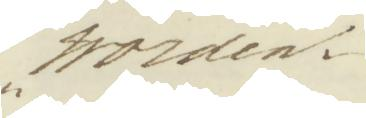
„worden.
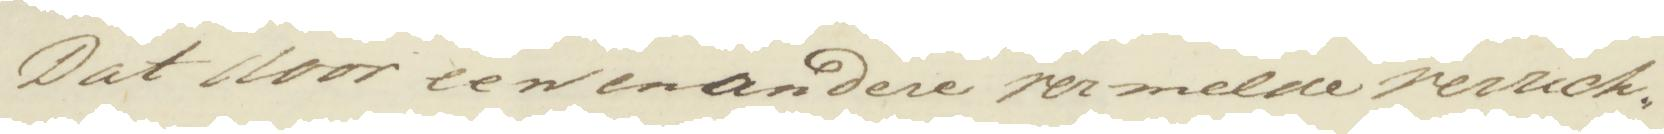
Dat door een en andere vermelde verrich„
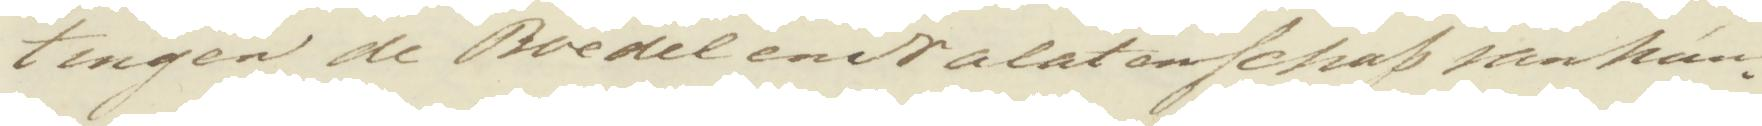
tingen de Boedel en Nalatenschap van hun„
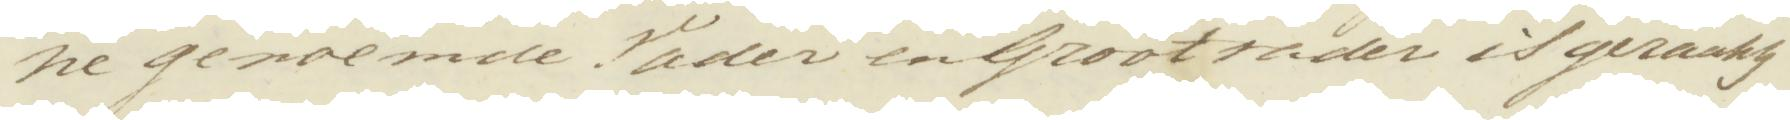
ne genoemde Vader en Grootvader is geraakt
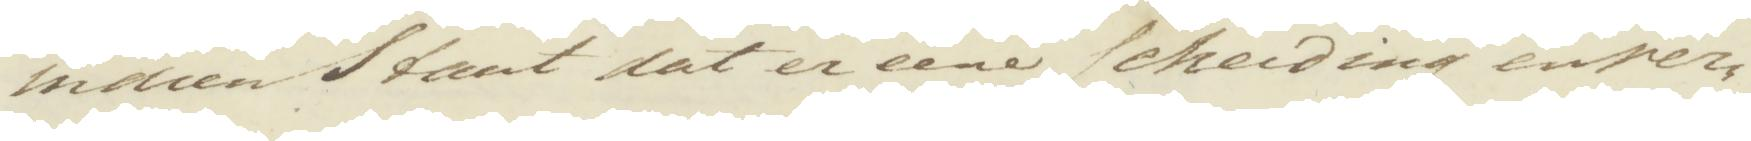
indien staat dat er eene scheiding en ver„
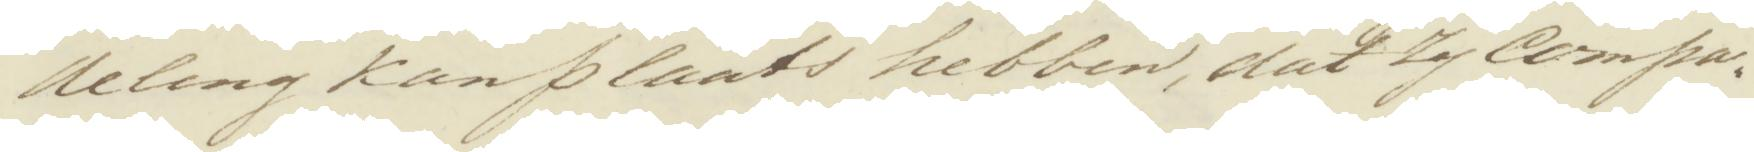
deling kan plaats hebben, dat zy Compa„
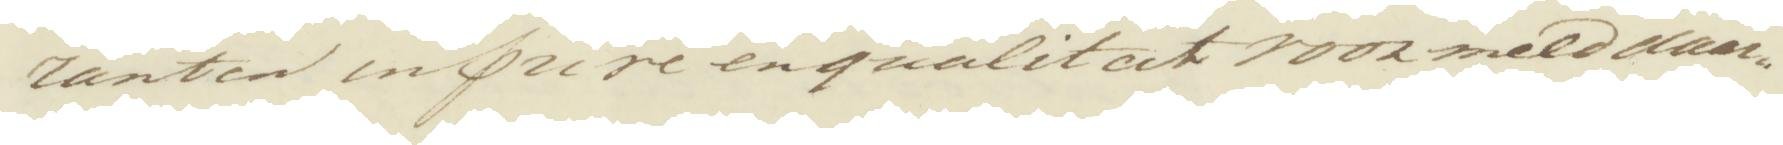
ranten in privé en qualiteit voormeld daar„
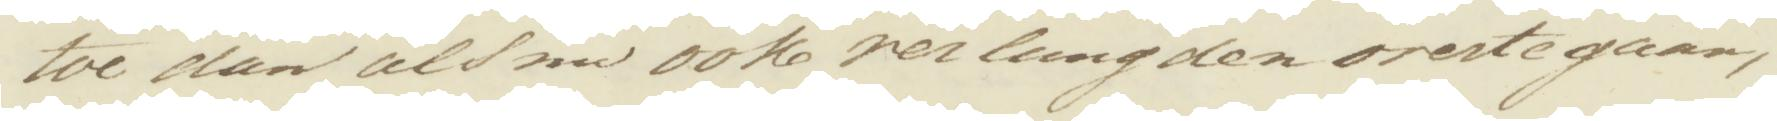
toe dan als nu ook verlangden overtegaan,
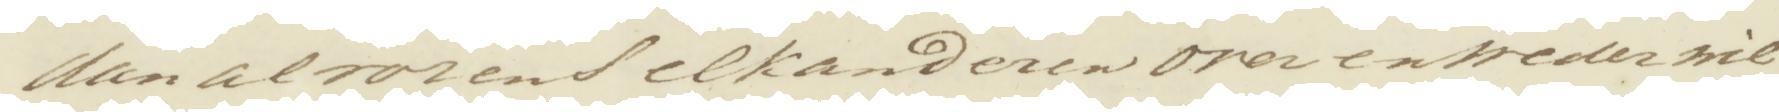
dan alvorens elkanderen over en weder wil
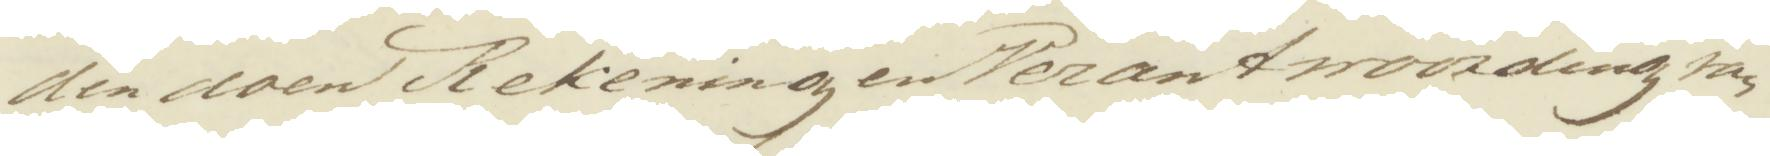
den doen Rekening en Verantwoording van
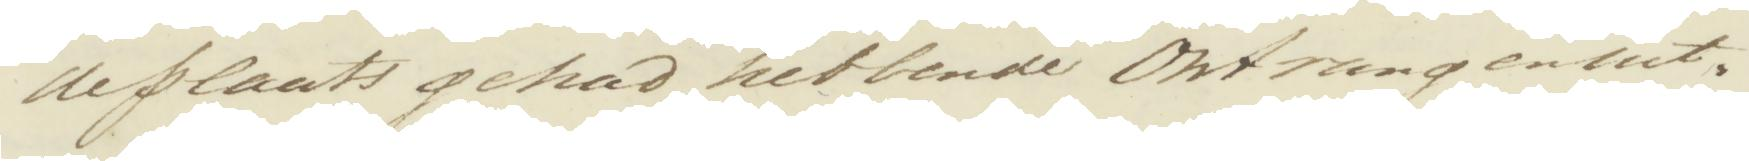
de plaats gehad hebbende Ontvang en uit„
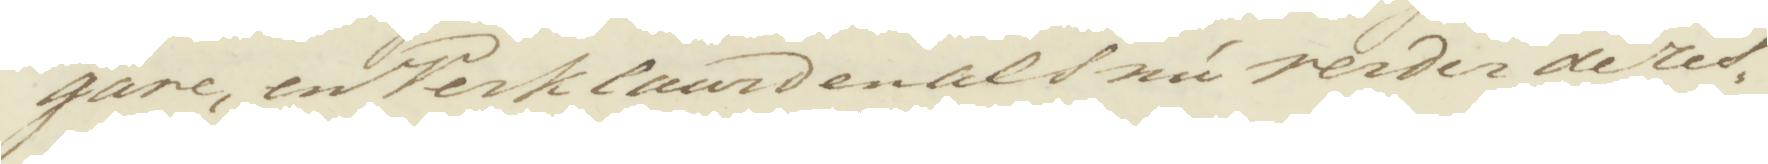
gave, en Verklaarden als nu verder de res„
